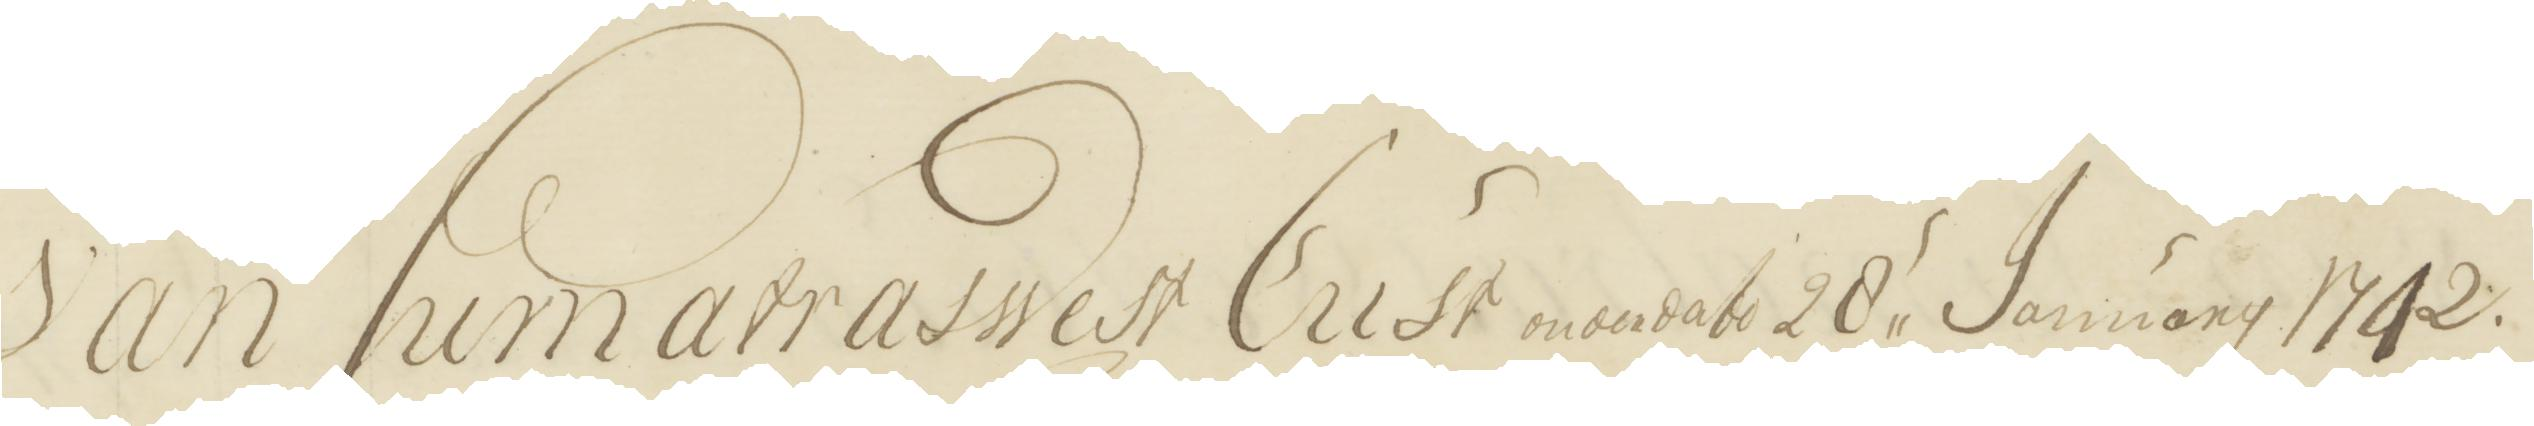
Van Sumatras west Cust onder dato 28„' January 1742.
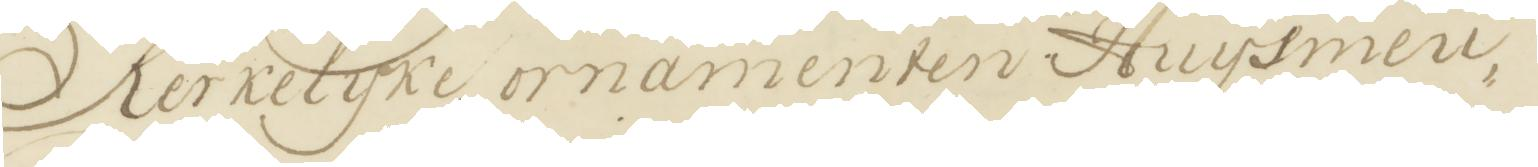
Kerkelyke ornamenten Huysmeu„
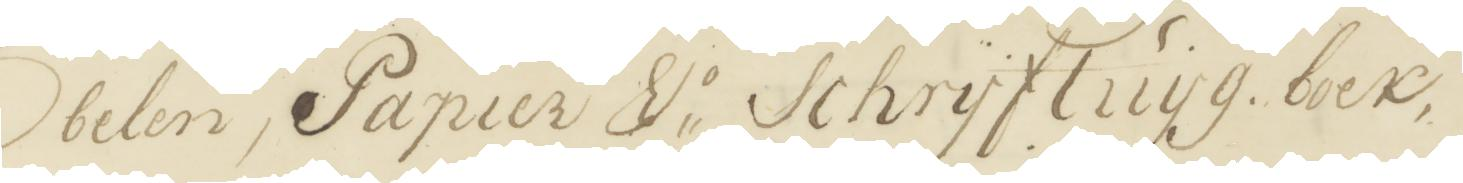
belen, Papier h„o Schryftuyg. boek,
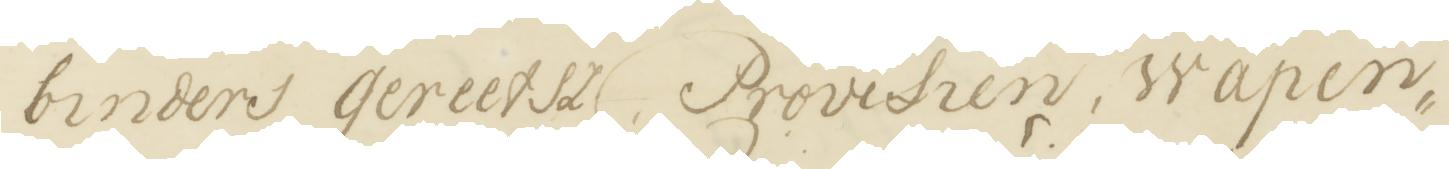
binders gereetsz, Provisien, wapen„
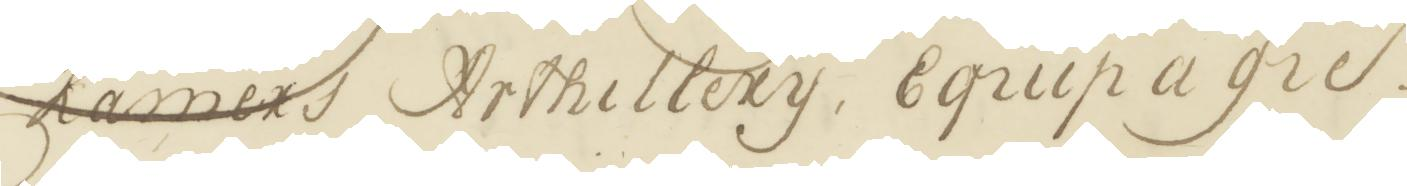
kamers Arthillery, Equipagie.
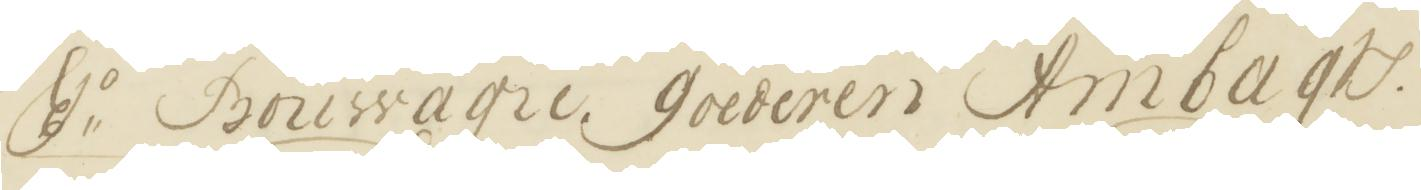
h„o Bouwagie goederen Ambagts.
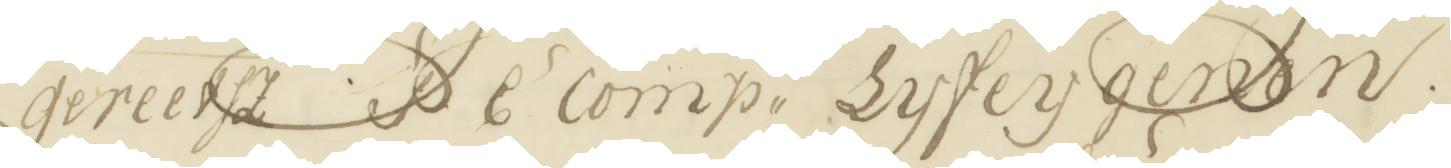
gereetsz 's E' Comp„s lyfeygenen.
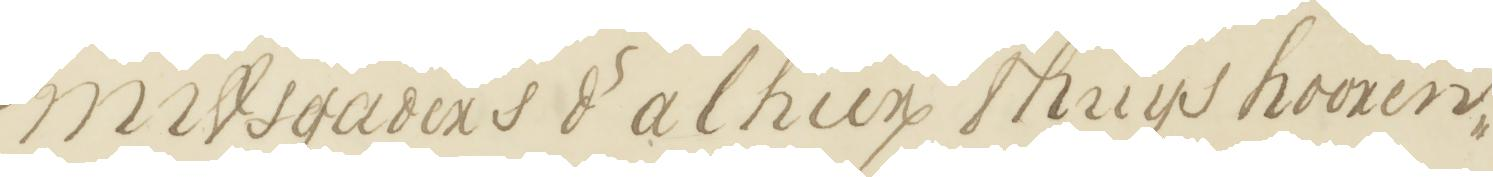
mitsgaders d’ alhier Thuys hooren„
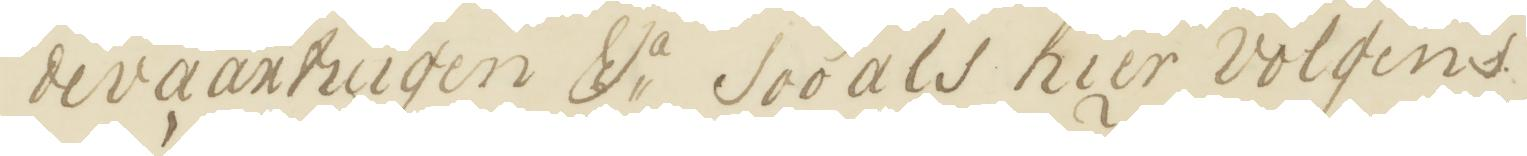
de vaartuigen h„o soo als hier volgens
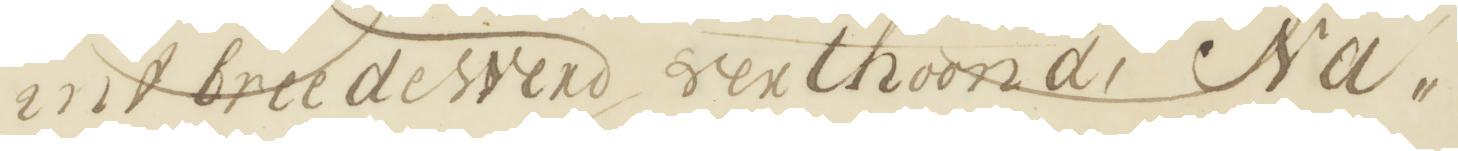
in't breede werd verthoond, Na„
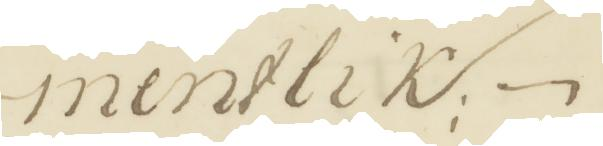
mentlik;-
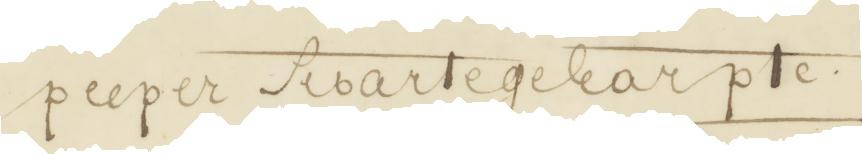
peeper swarte geharpte
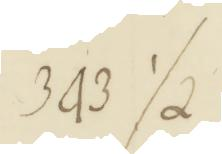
343 ½
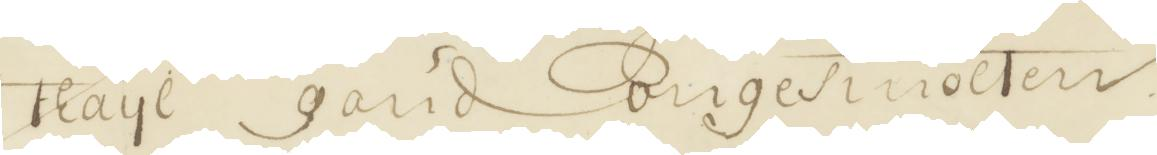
thayl goud ongesmolten
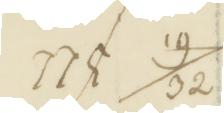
775 19/32
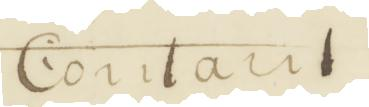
Contant
